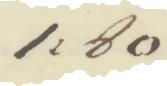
1:80
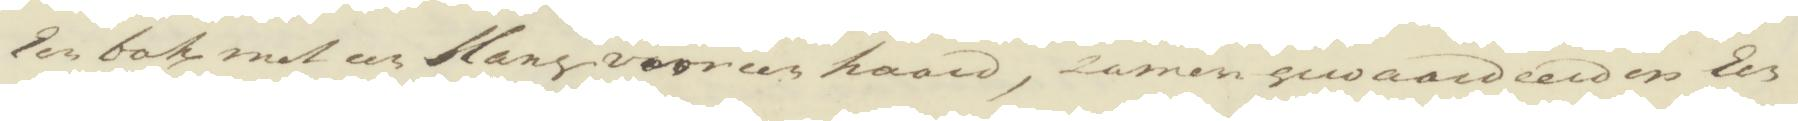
Een bak met een Hang voor een haard, zamen gewaardeerd op Een
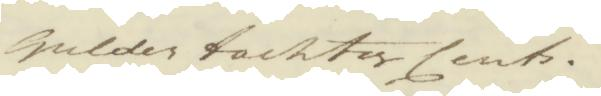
Gulden tachtig Cents.
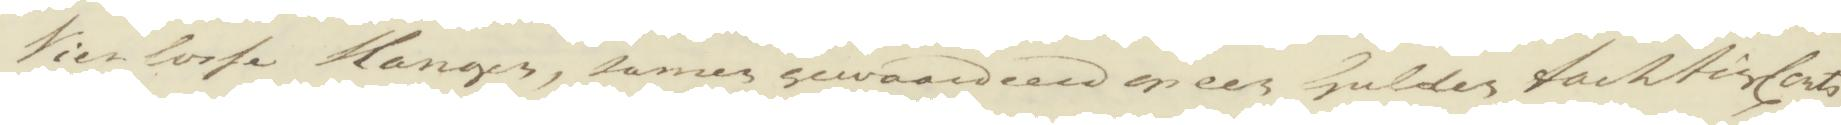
Vier losse Hangen, zamen gewaardeerd op een Gulden tachtig Cents
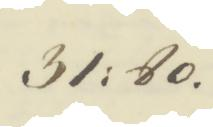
31:80.
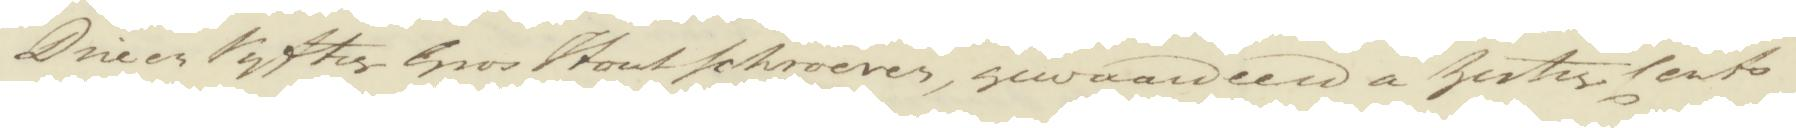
Drie en Vijftig Gros stout schroeven, gewaardeerd a Zestig Cents
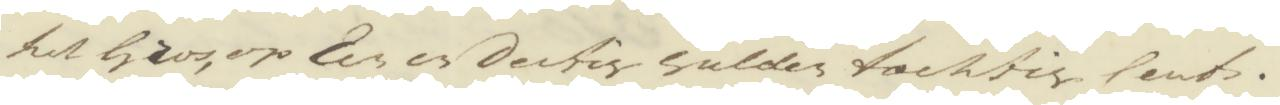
het Gros, op Een en dertig Gulden tachtig Cents.
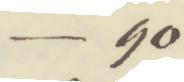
— 90
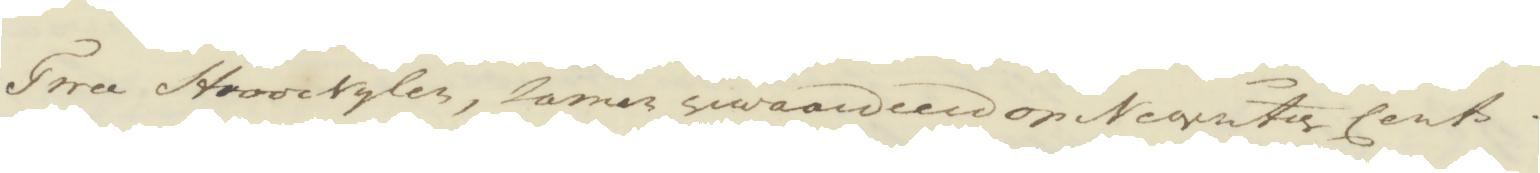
Twee strooivylen, zamen gewaardeerd op Negentig Cents
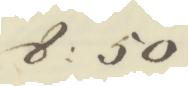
8: 50
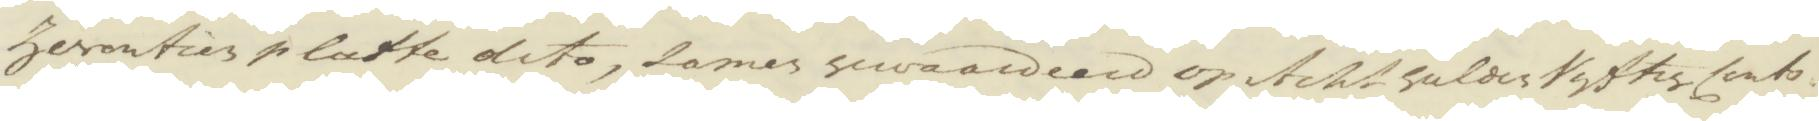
Zeventien platte dito, zamen gewaardeerd op Acht gulden Vyftig Cents
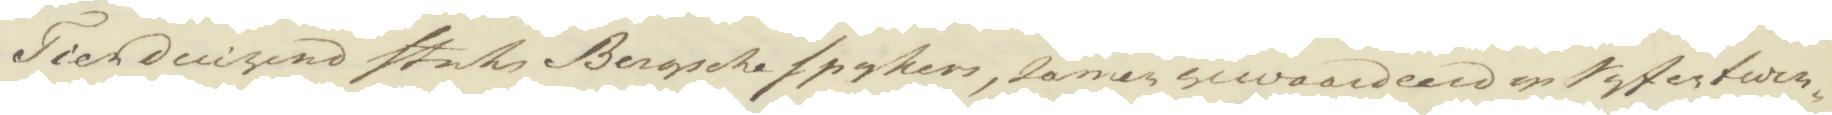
Tien duizend stuks Bergsche spykers, zamen gewaardeerd op Vyf en twin„
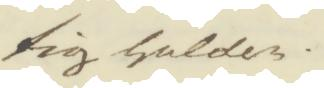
tig Gulden.
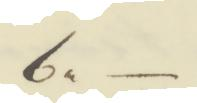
6 „ —
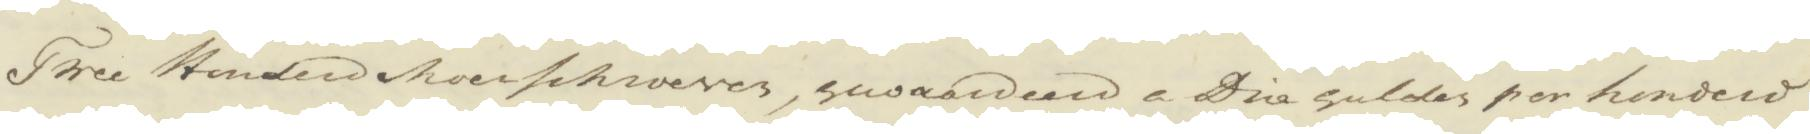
Twee Honderd Moerschroeven, gewaardeerd a Drie gulden per honderd
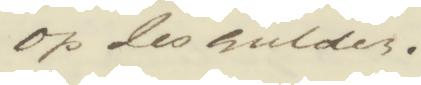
op zes gulden.
